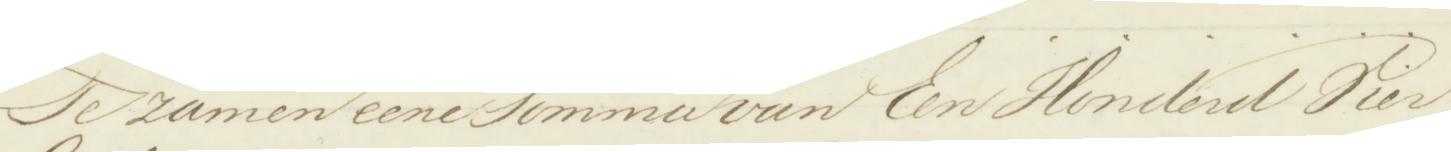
Te zamen eene somma van Een Honderd Vier
